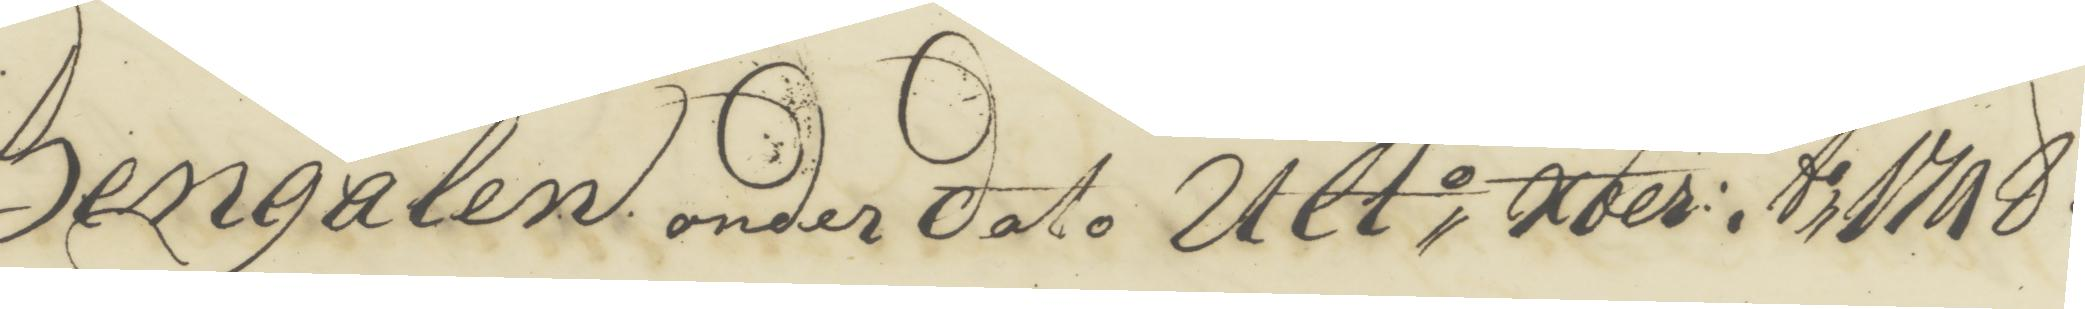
Van Bengalen onder dato Ult„o xber: A„o 1748.
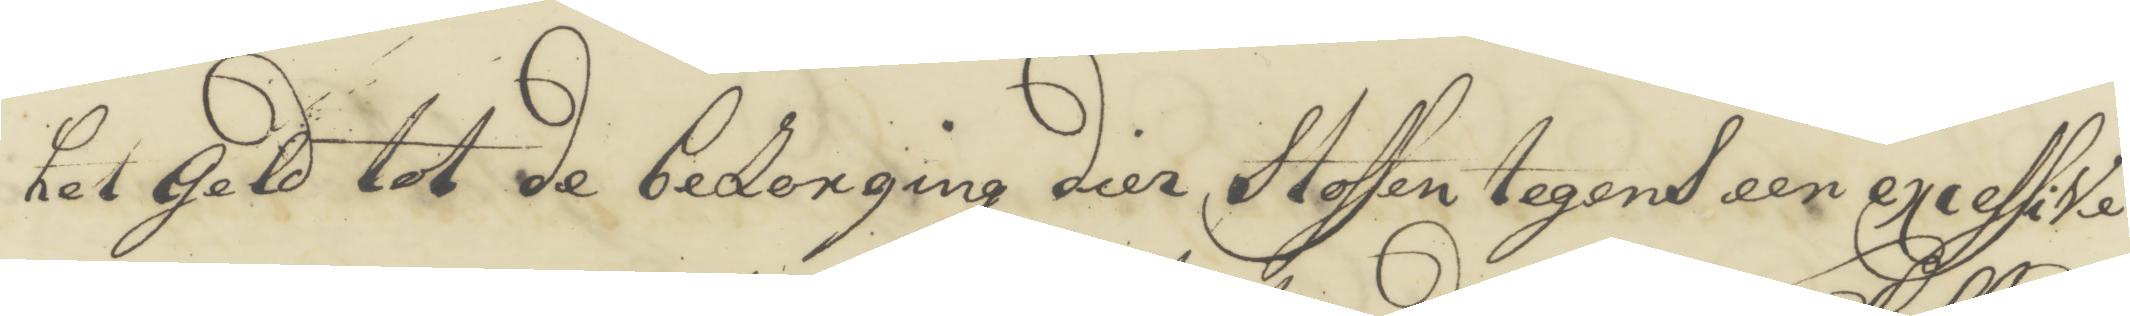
het geld tot de bezorging dier stoffen tegens een excessive
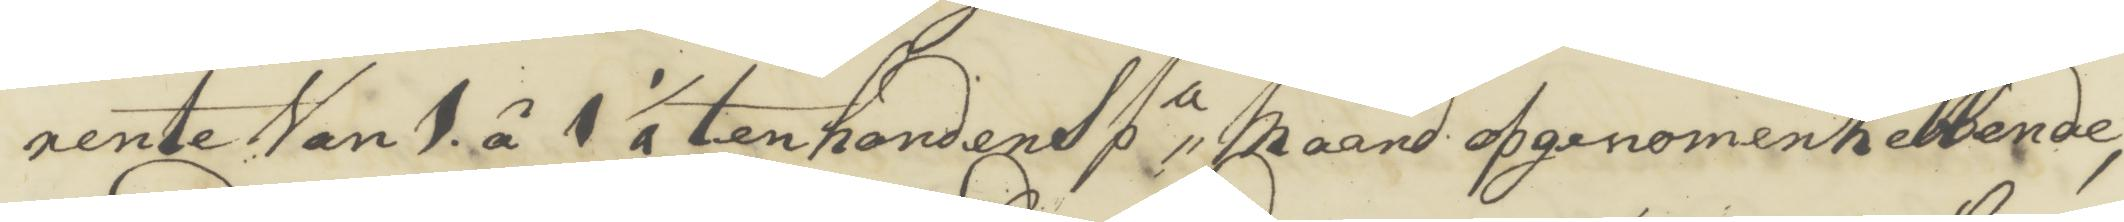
rente van 1. â 4¼ ten hondens p„r maand opgenomen hebbende,
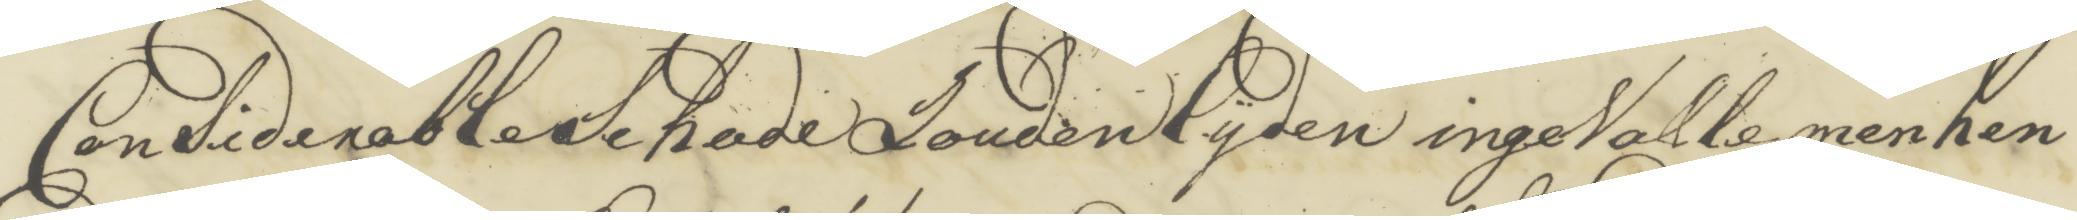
Considerable schade zouden lijden ingevalle men hen
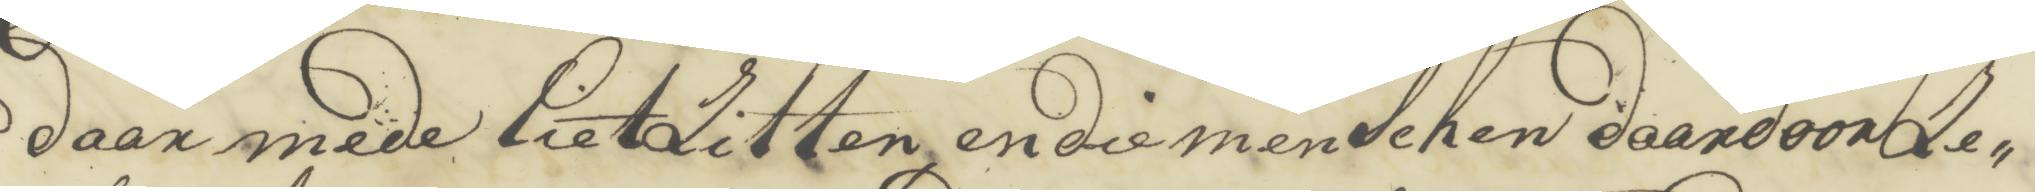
daar mede liet zitten, en die menschen daardoor ze„
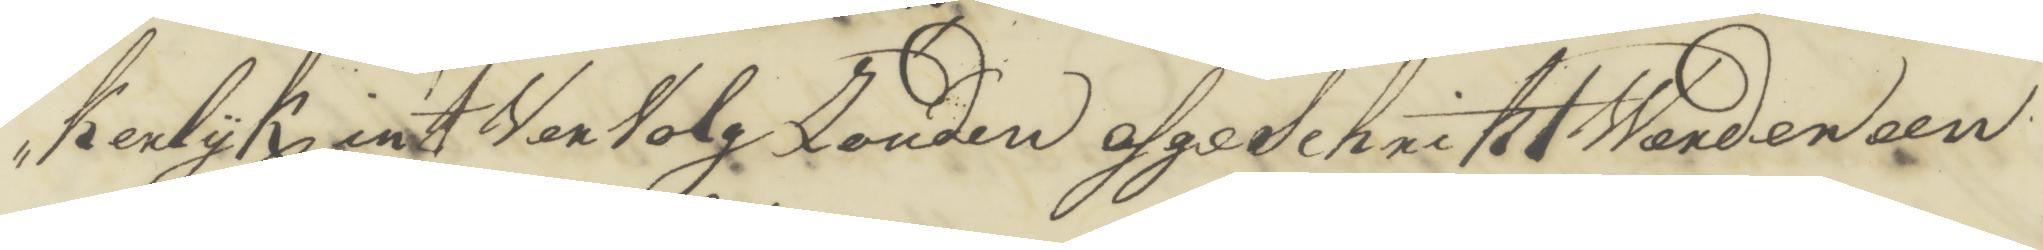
„kerlijk in't vervolg zouden afgeschrikt werden een
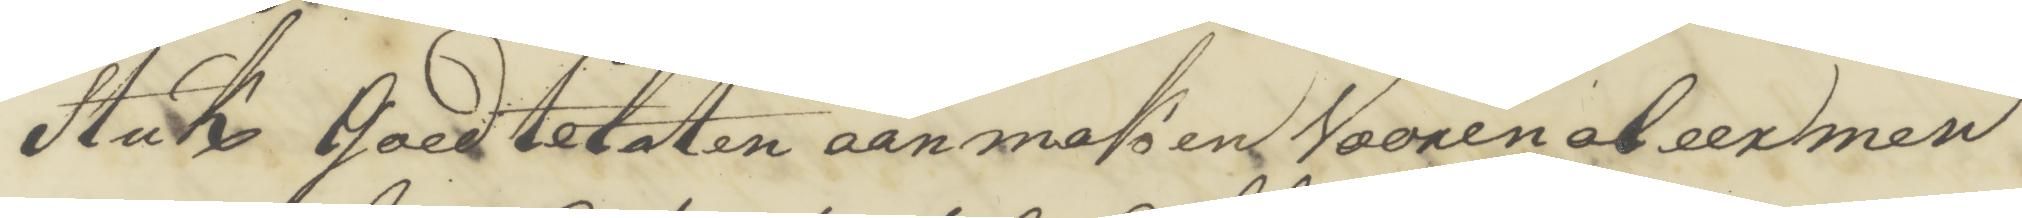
stuk goed te laten aan maken vooren al eer men
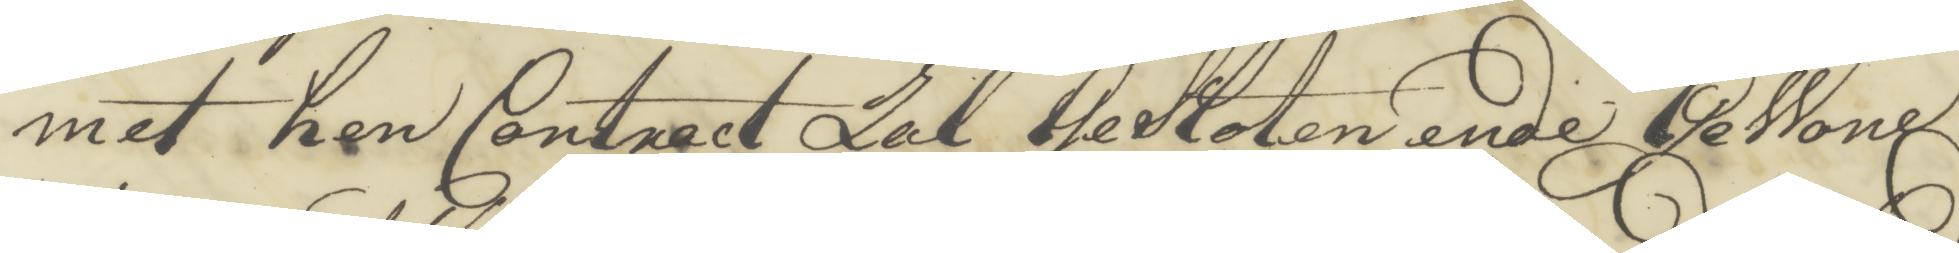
met hen Contract zal gesloten ende gewone
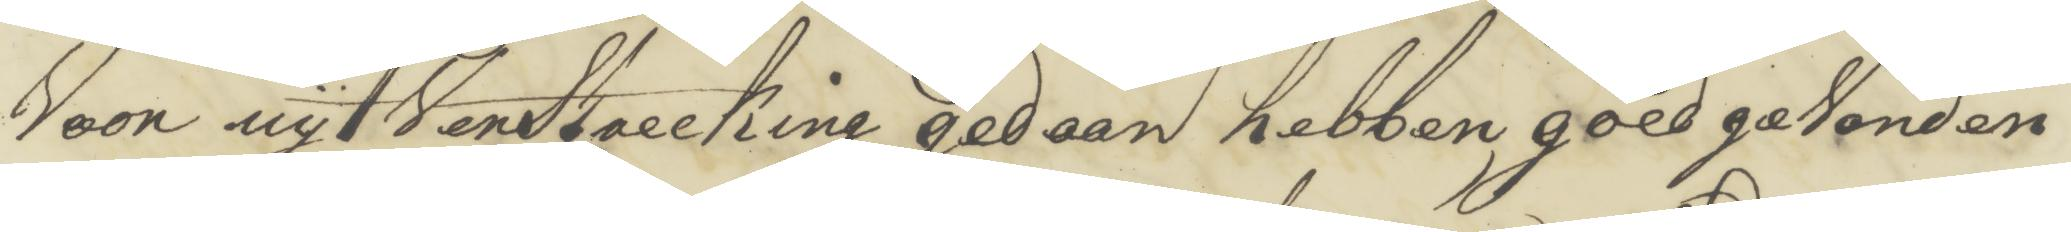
voor uijt verstreeking gedaan hebben goed gevonden
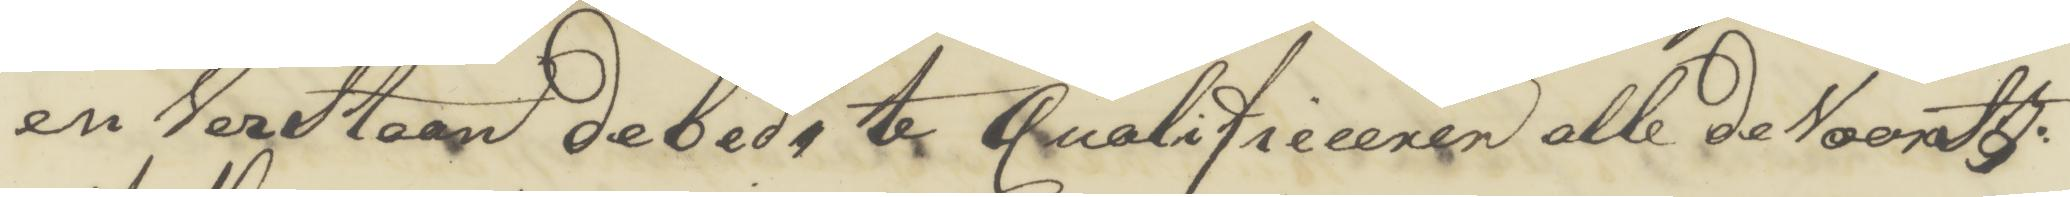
en verstaan de bed„s te qualificeeren alle de voorsz:
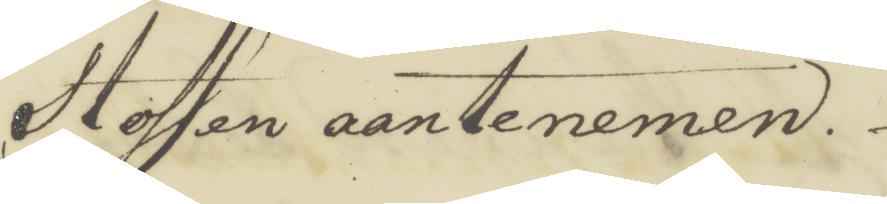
stoffen aan te nemen.
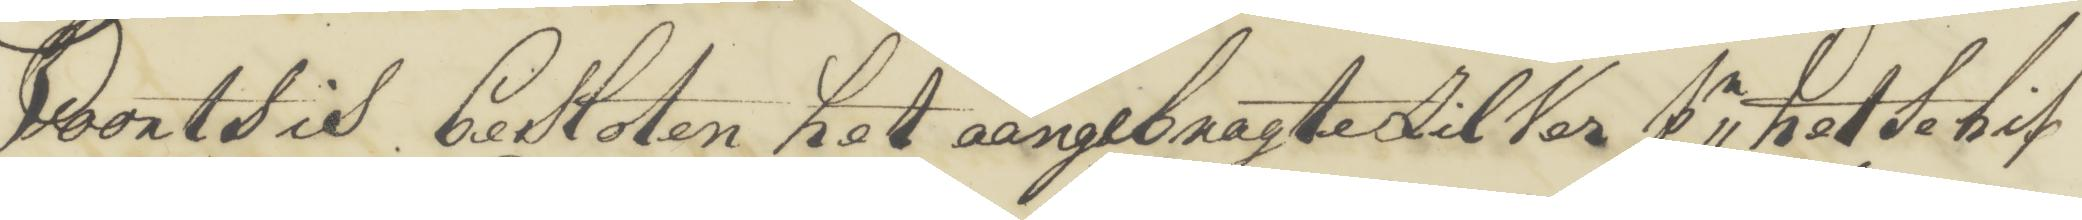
Voorts is besloten het aangebragte zilver p„r het schip
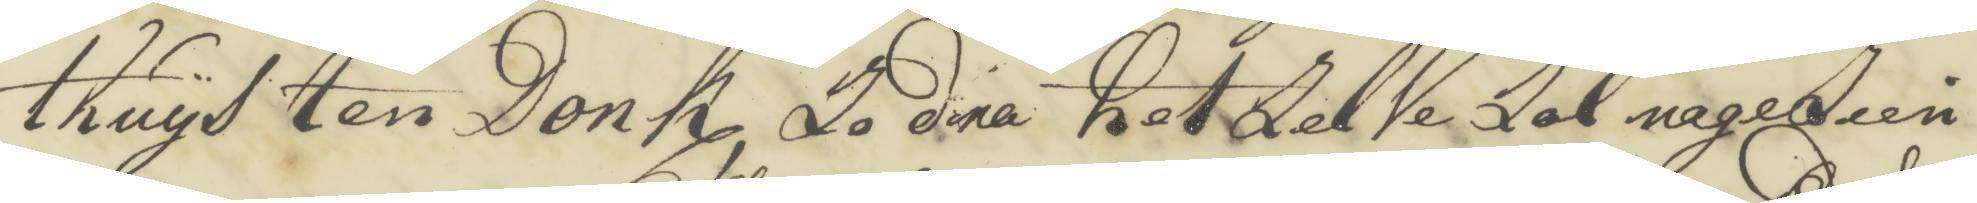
thuijs ten Donk zo dra het zelve zal nagezien
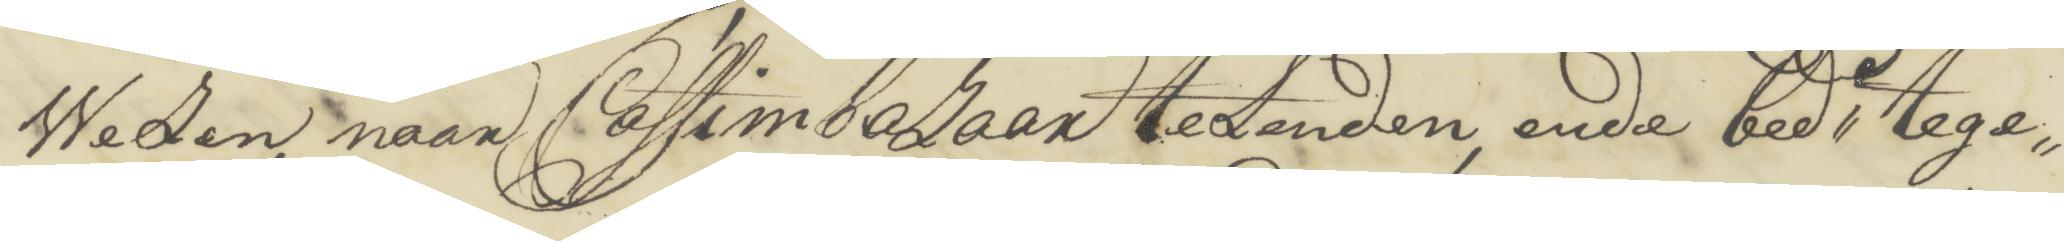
wezen, naar Cassimbazaar te senden, ende bed„s tege„
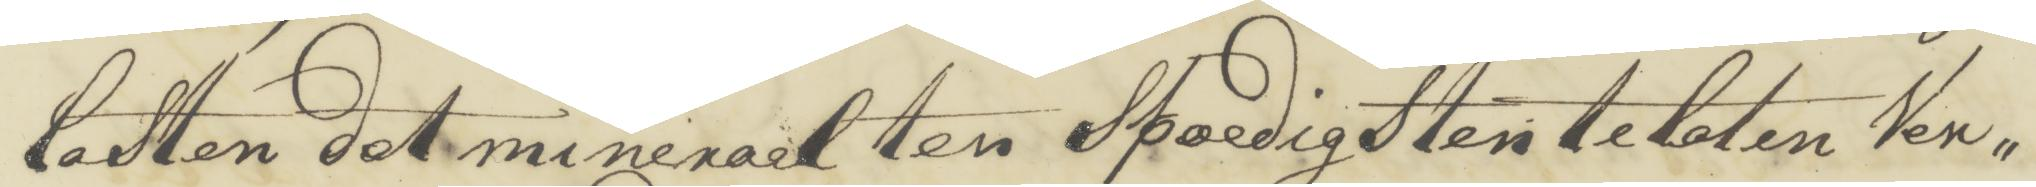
lasten det minerael ten spoedigsten te laten ver„
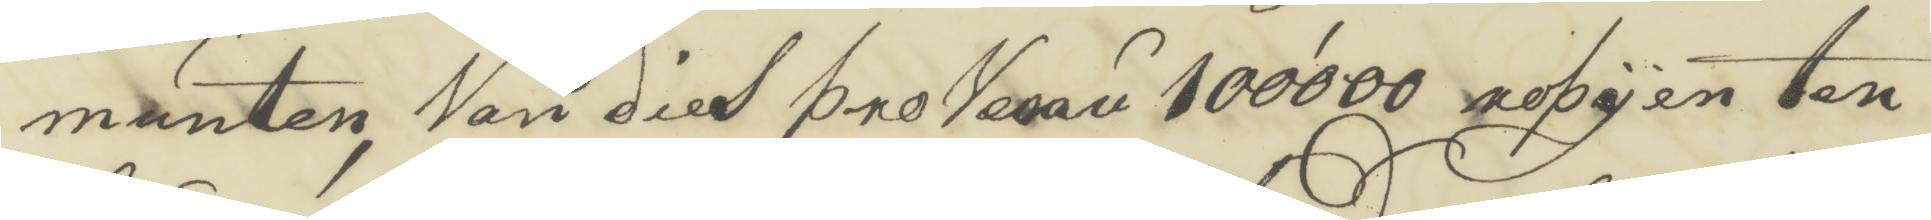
munten, van dies pro venu 100'000 ropijen ten
